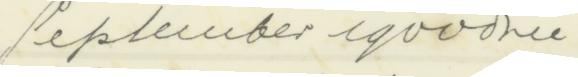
September 1900drie
